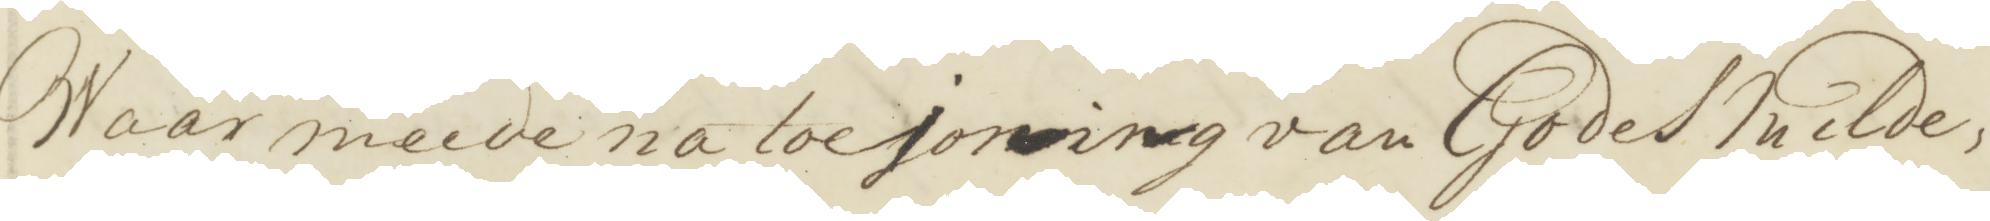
Waar meede na toejoning van Godes Milde„
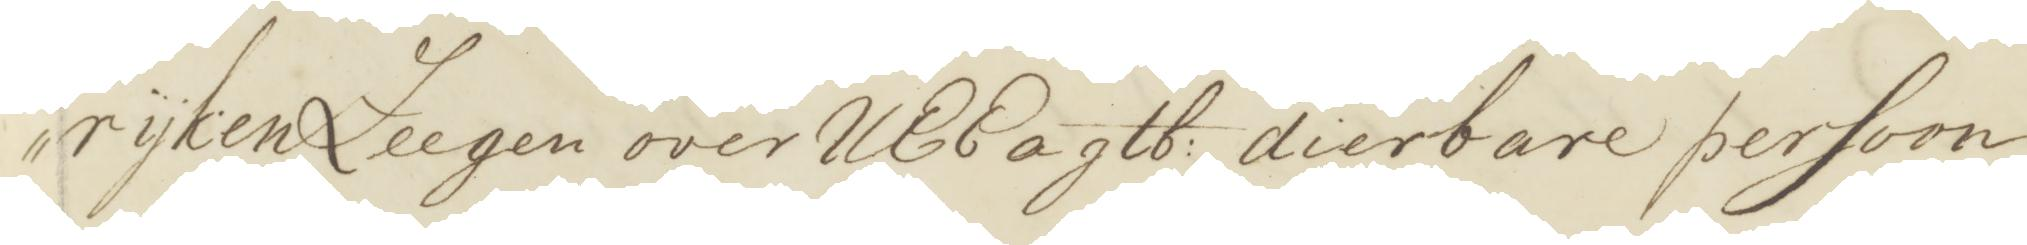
„rijken Zeegen over UEEagtb: dierbare persoon
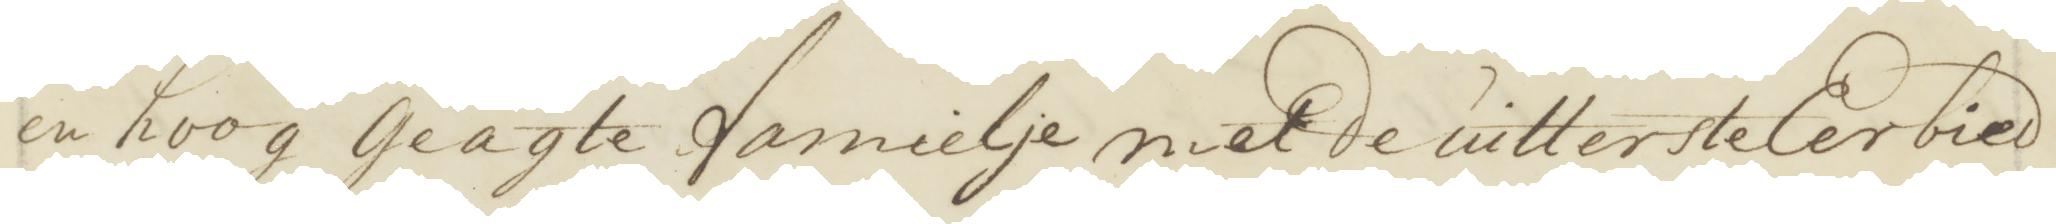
en hoog geagte famielje met de uitterste Eerbied
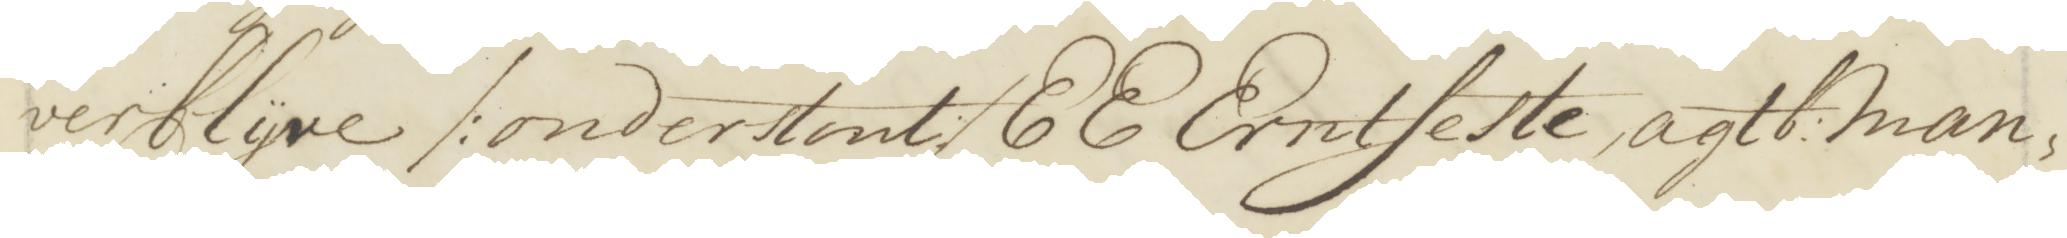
verblijve /: onderstont :/ E E Erntfeste, agtb: man„
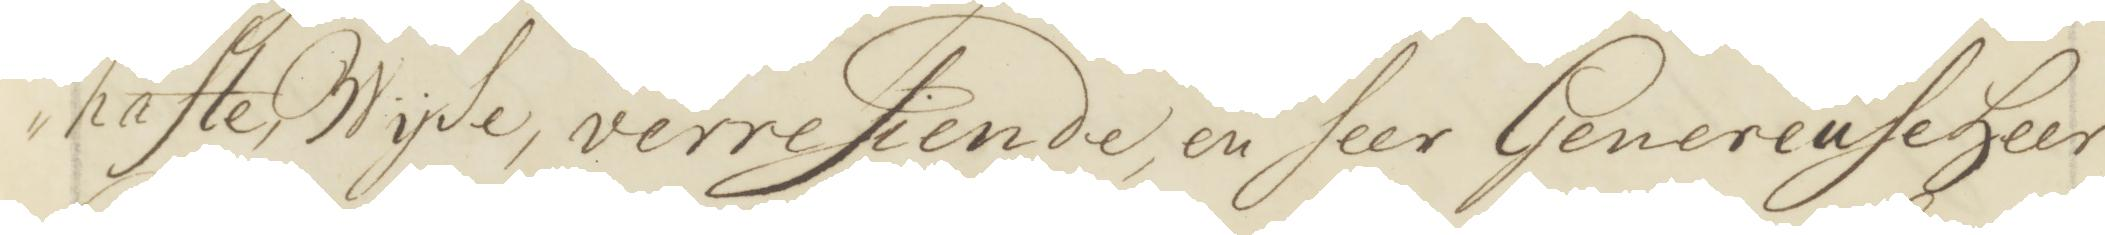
„hafte, Wijse, verresiende, en seer Genereuse Heer
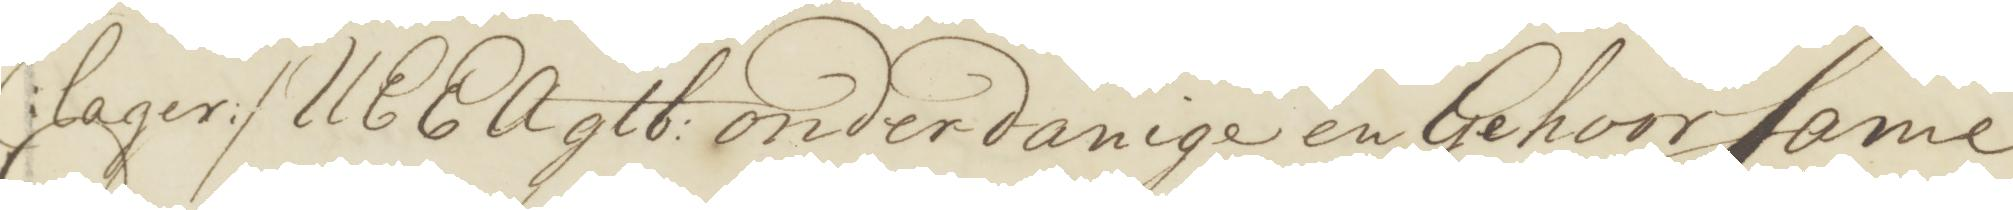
(: lager :/ UEEAgtb: onderdanige en Gehoorsame
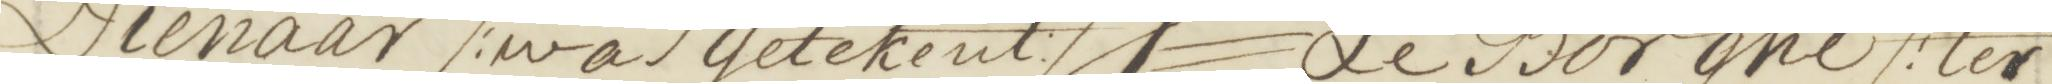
Dienaar /: was Getekent :/ J=bus Le Borgne /: ter
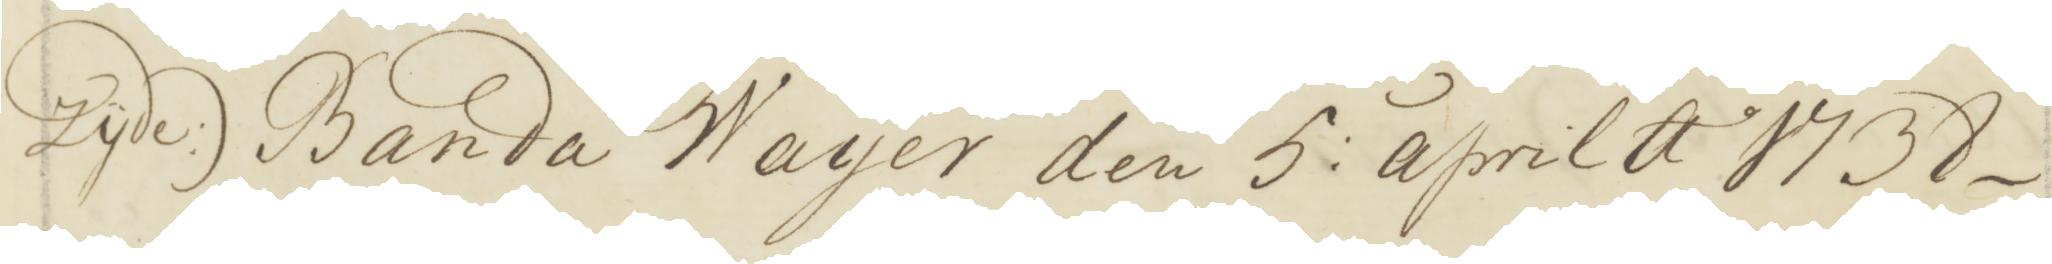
zijde :) Banda Waijer den 5:' april Ao 1738 —
